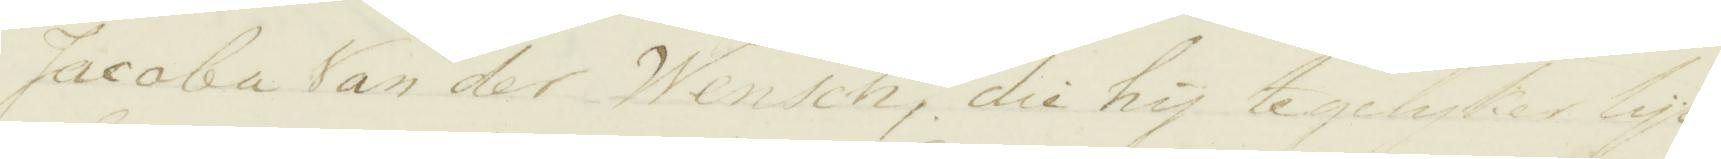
Jacoba Van der Wensch, die hij te gelyker tijd
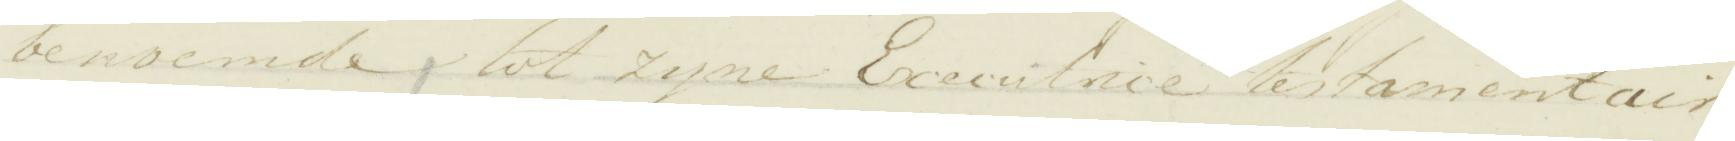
benoemde tot zyne Executrice testamentair
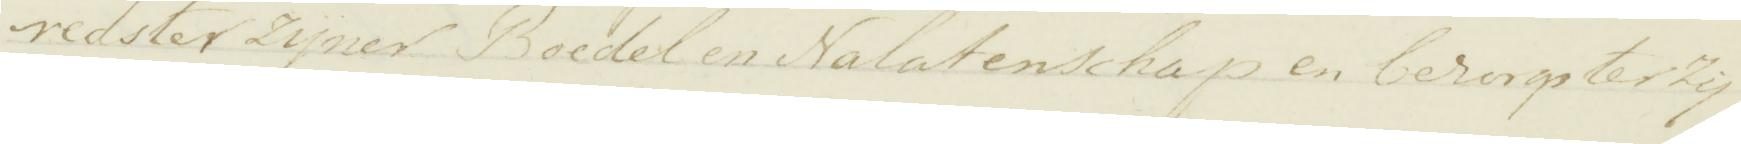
redster zijner Boedel en Nalatenschap en bezorgster zij
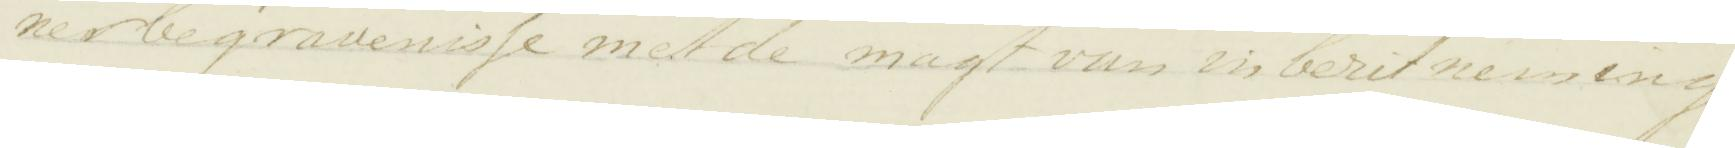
ner begravenisse met de magt van in bezitneming
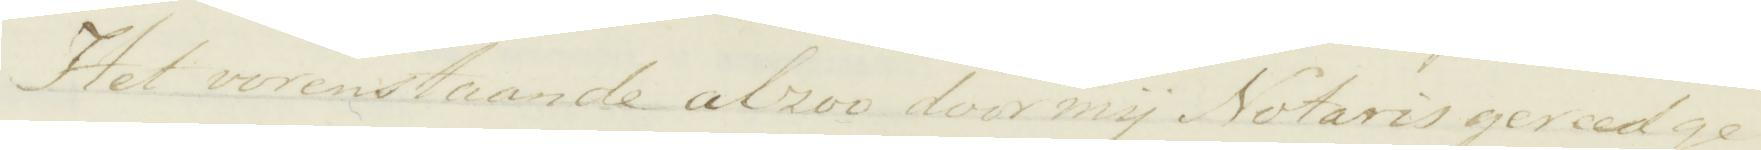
Het vorenstaande alzoo door mij Notaris gereed ge
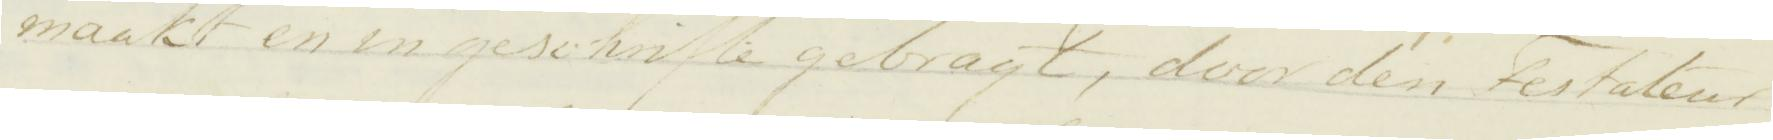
maakt en in geschrifte gebragt, door den Testateur
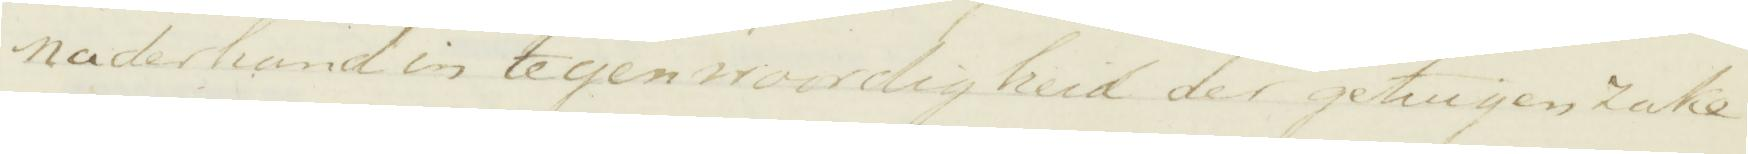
naderhand in tegenwoordigheid der getuigen zake
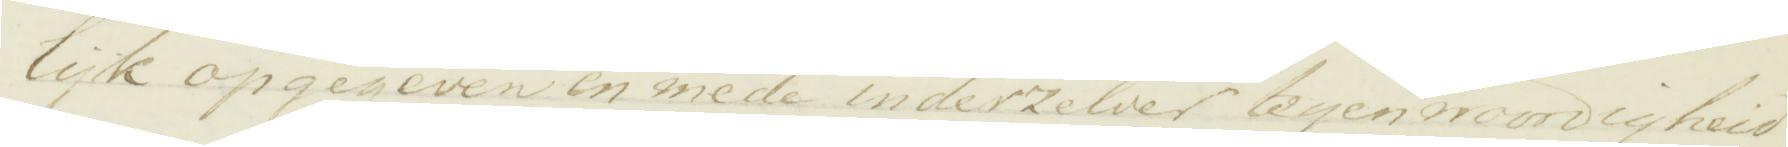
lijk opgegeven en mede in derzelver tegenwoordigheid
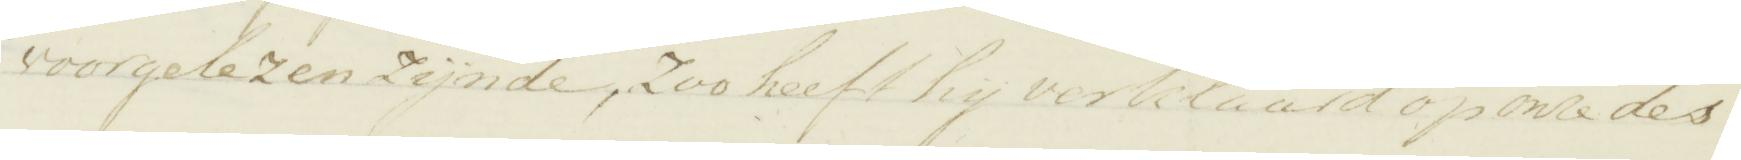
voorgelezen zijnde, zoo heeft hij verklaard op onze des
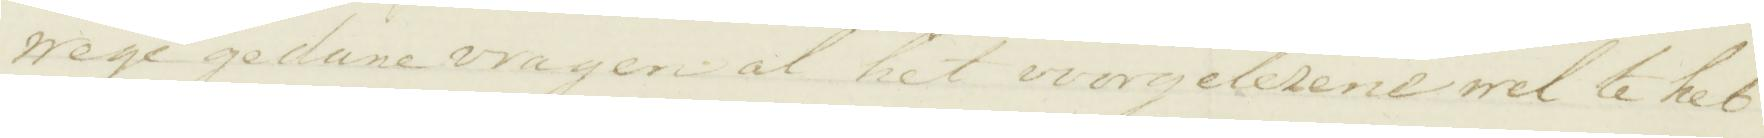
wege gedane vragen al het voorgelezene wel te heb
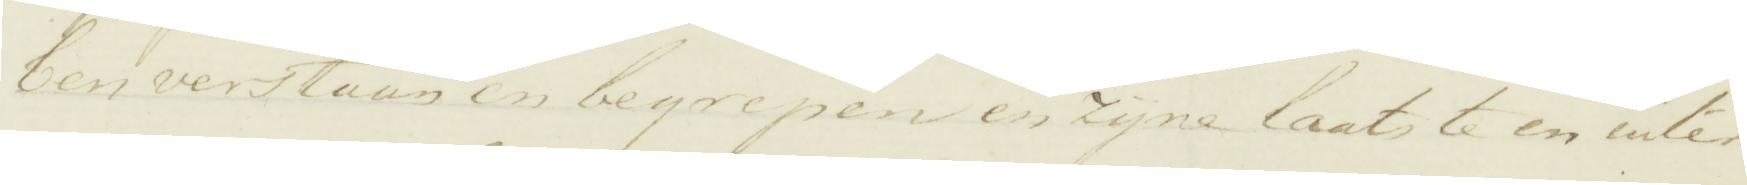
ben verstaan en begrepen en zijne laatste en uiter
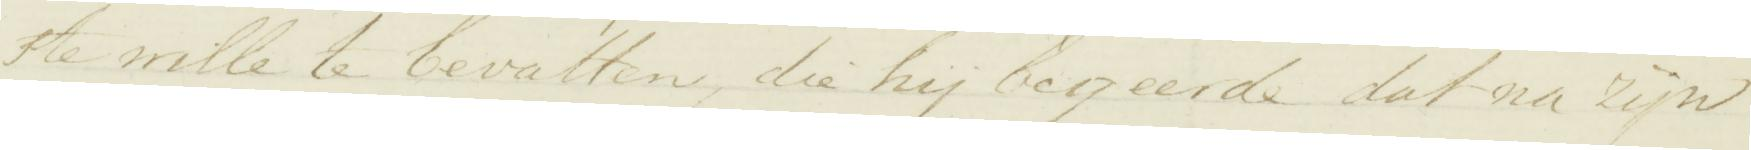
ste wille te bevatten, die hij begeerde dat na zijn
